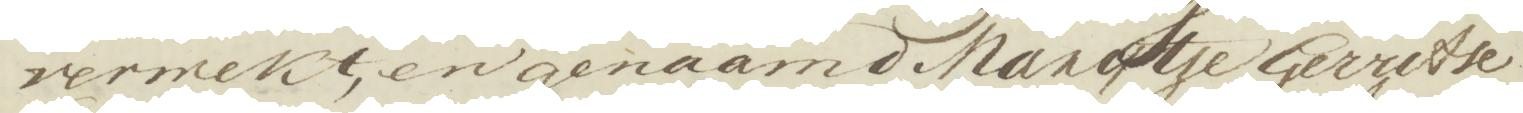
verwekt, en genaamd Margtje Gerritse
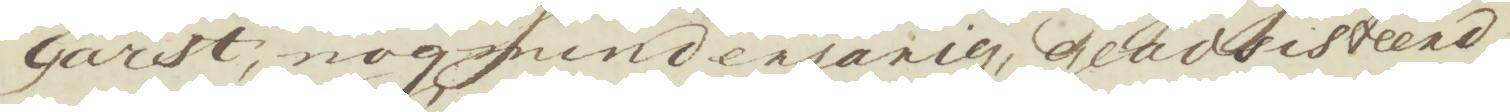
Garst, nog minderjarig, geadsisteerd
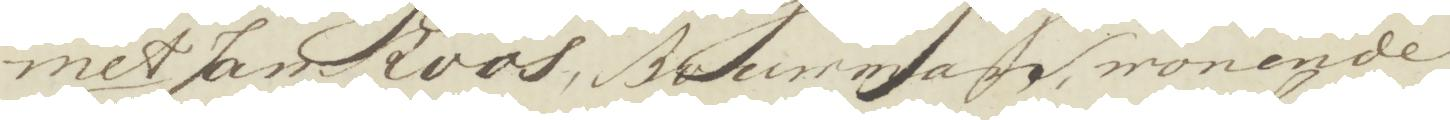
met Jan Roos, Bouwman, wonende
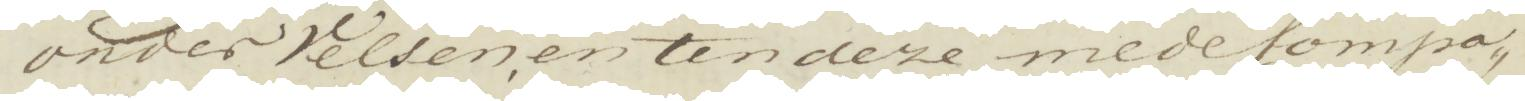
onder Velsen, en ten deze mede Compa„
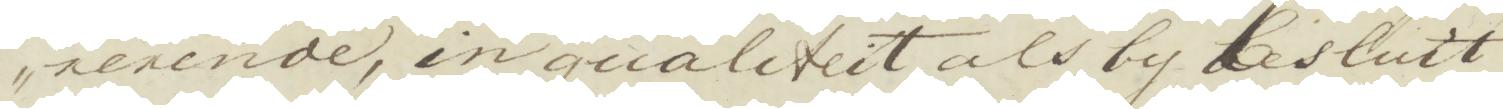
„rerende, in qualiteit als by besluit
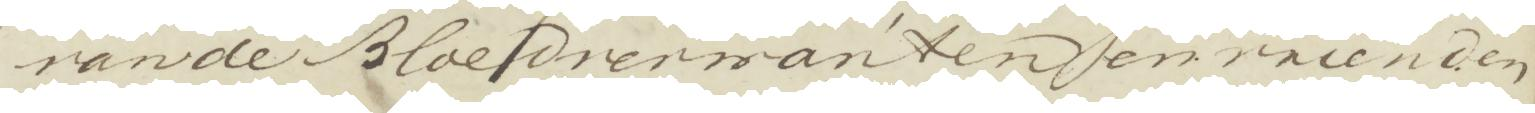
van de Bloedverwanten en vrienden
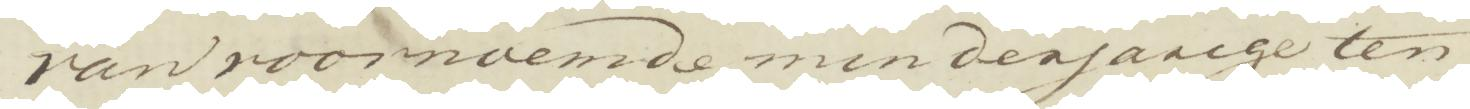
van voornoemde minderjarige ten
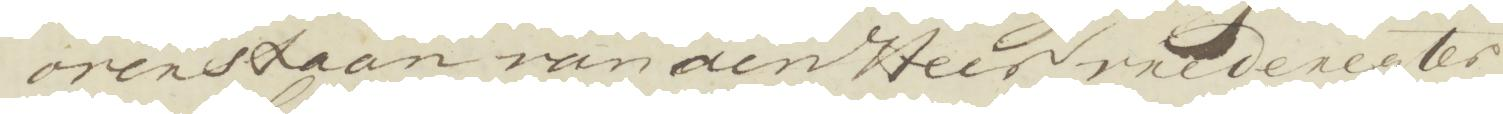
overstaan van den Heer vrederegter
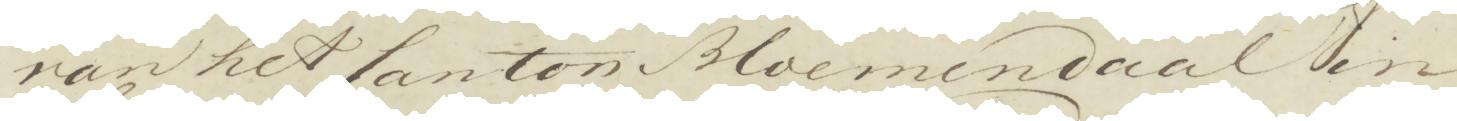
van het Canton Bloemendaal in
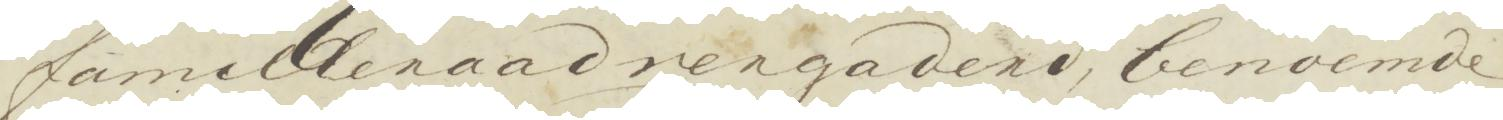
familieraad vergaderd, benoemde
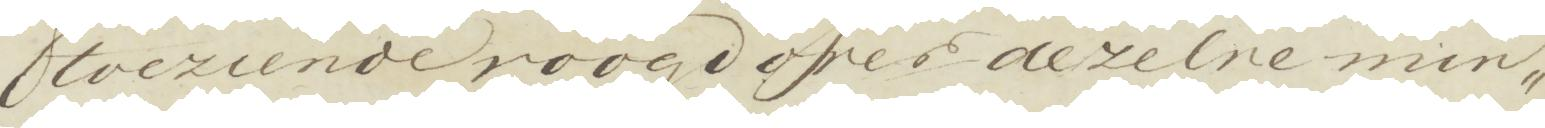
toeziende voogd over dezelve min„
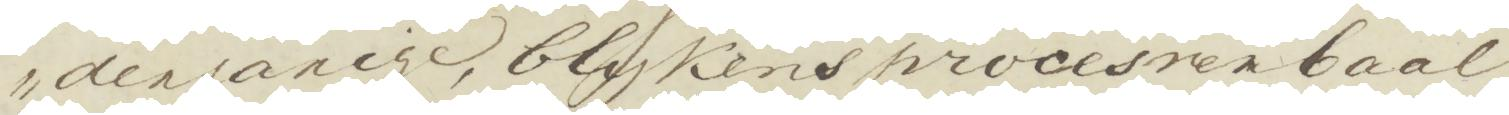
„derjarige, blykens procesverbaal
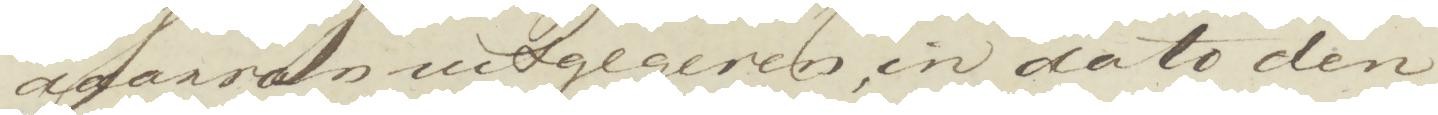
daarvan uitgegeven, in dato den
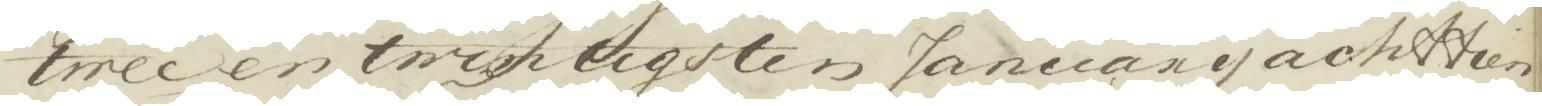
twee en twintigsten January achttien
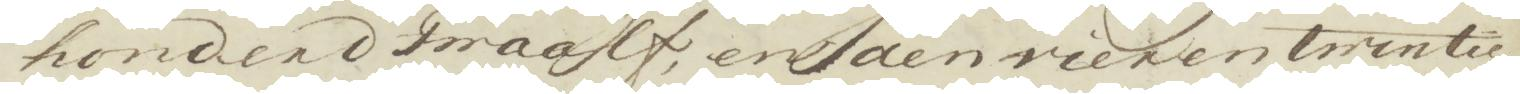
honderd Twaalf, en den vier en twintig
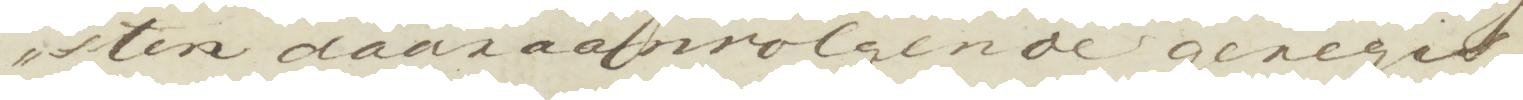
„sten daar aan volgende geregis
